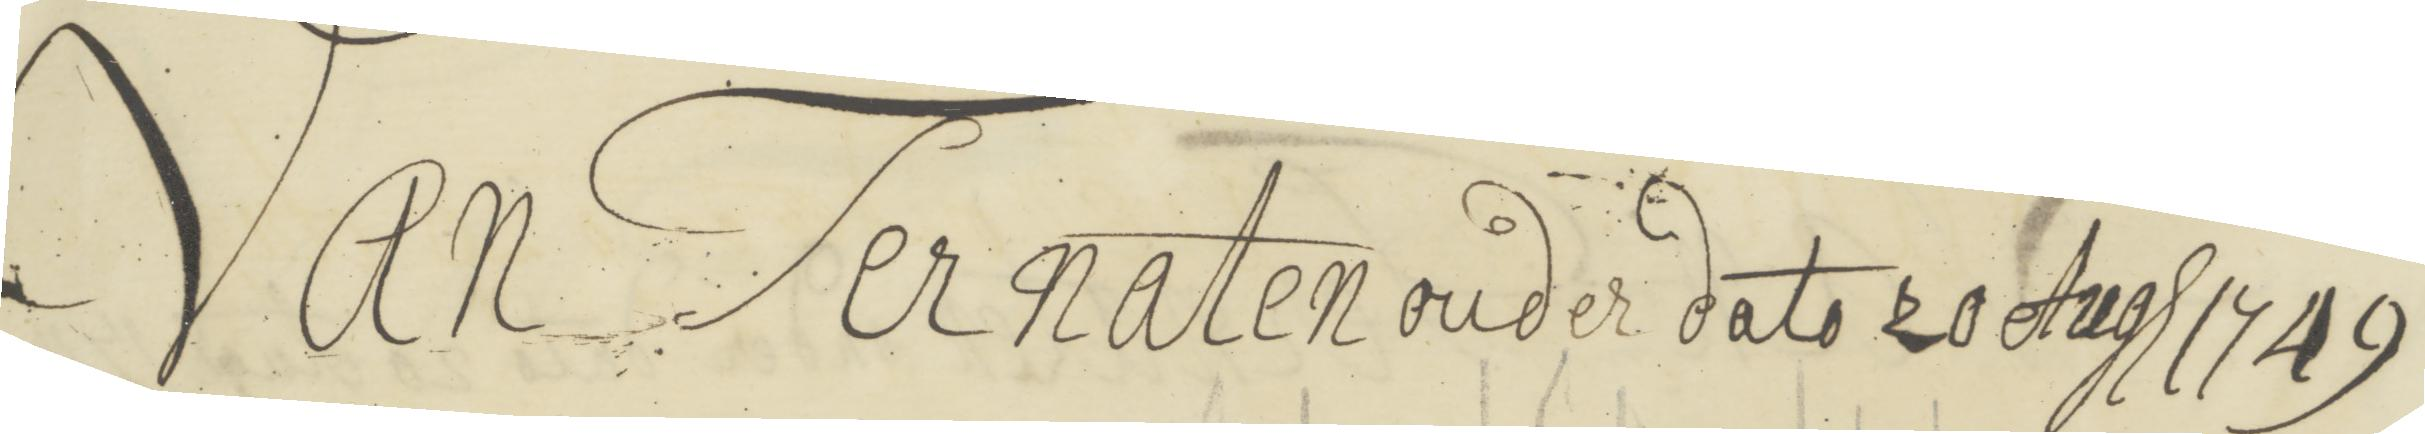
Van Ternaten onder dato 20 Augh 1749
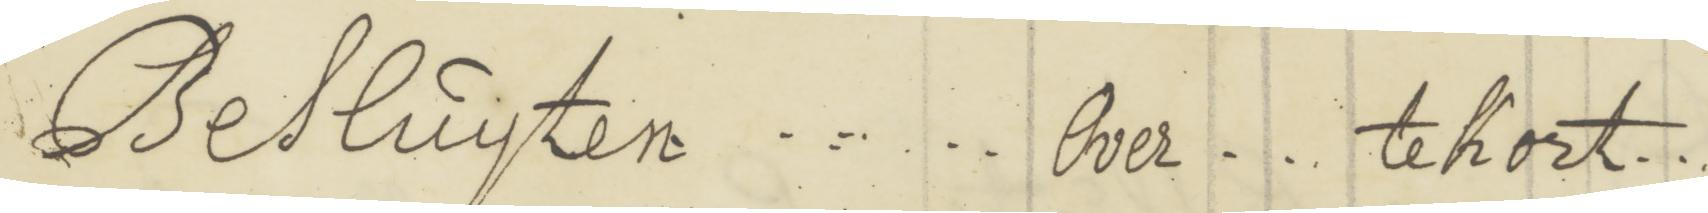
Besluijten - - - . . - - Over - - . tekort . .
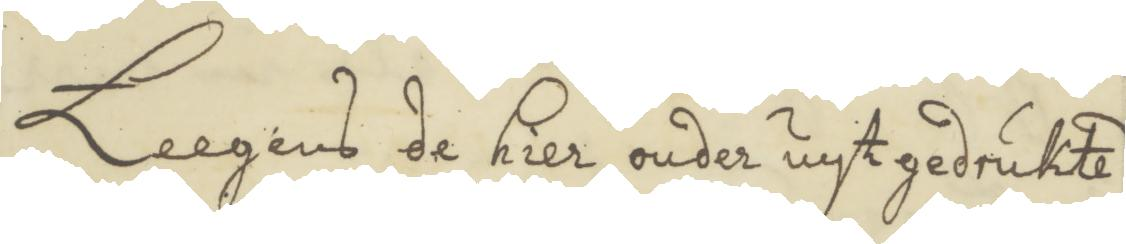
Teegens de hier onder uijt gedrukte
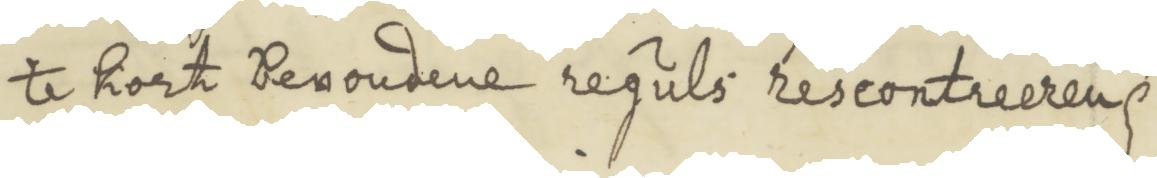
te kort bevondene reguls rescontreeren
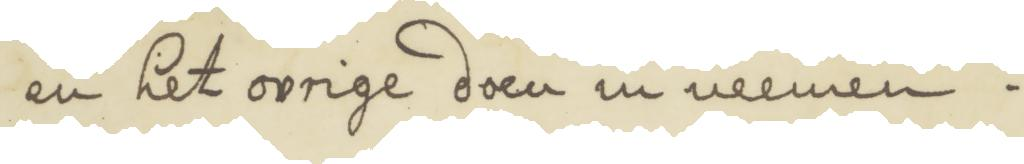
en het ovrige doen in neemen -
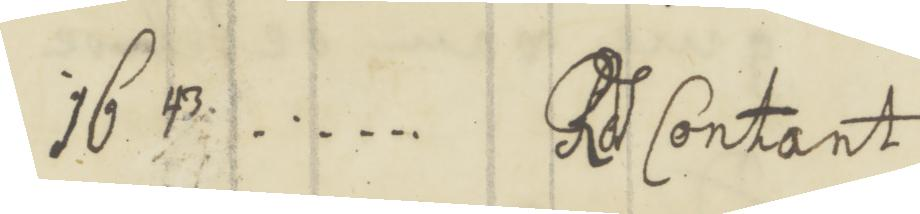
16 43 - - - - - . Rds Contant
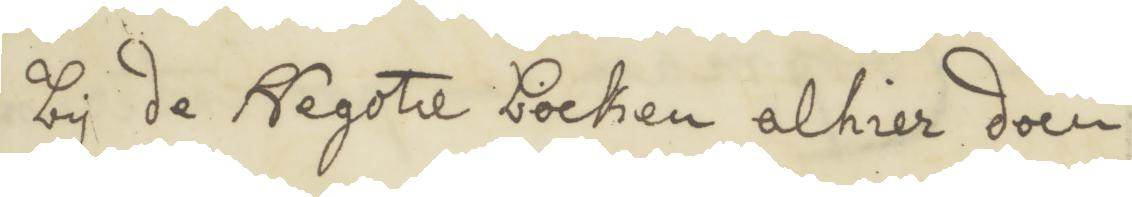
bij de Negotie boeken alhier doen
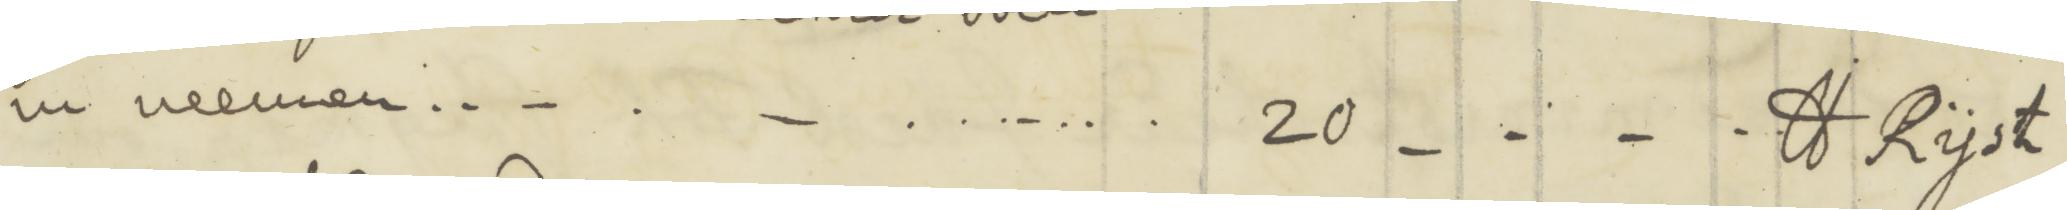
in neemen - - — . — . . . - . . . 20 — — — - .lb Rijst
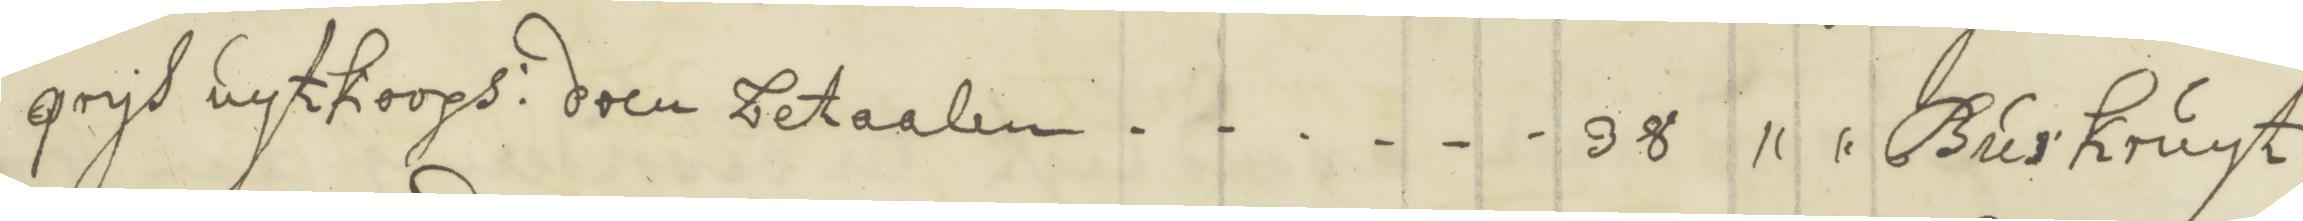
grijs uytkoops: doen betaalen - - . - - - 38 Buskruyt
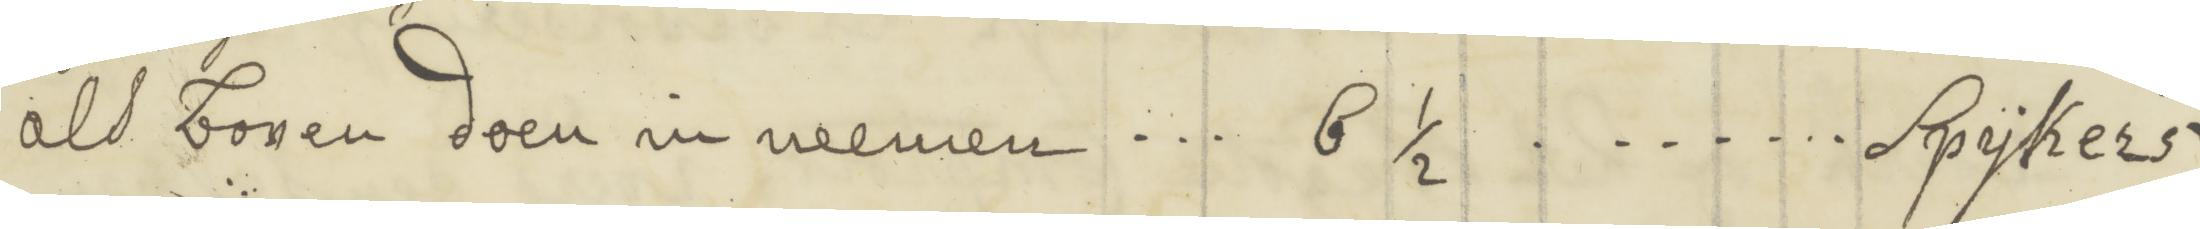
als boven doen in neemen . . . 6½ . - - - - . . Spijkers
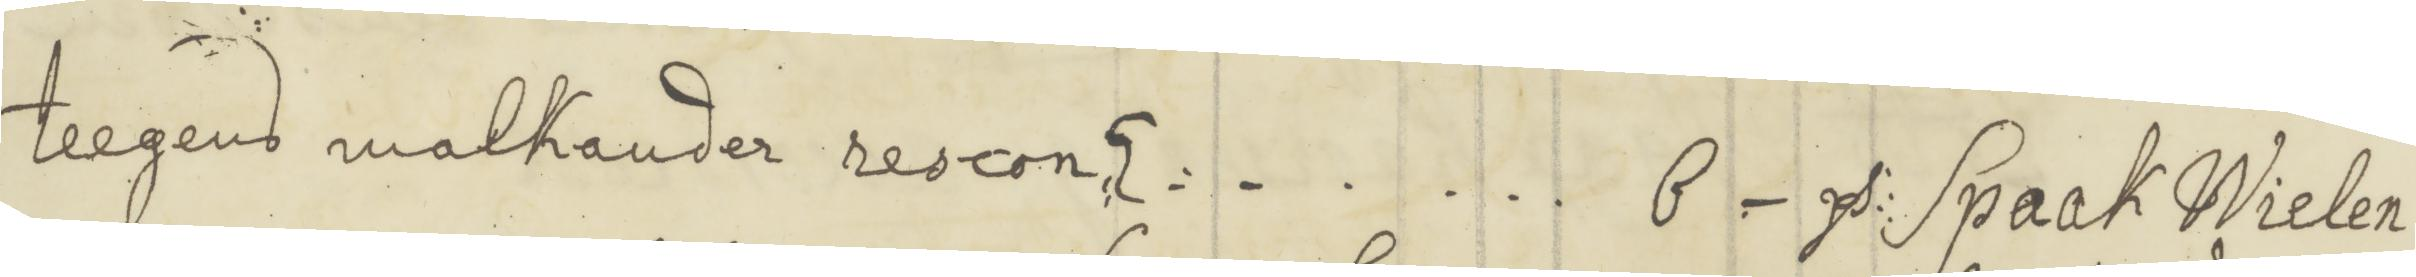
teegens malkande rescon„{ - - . . . . 6 .— ps: Spaak Wielen
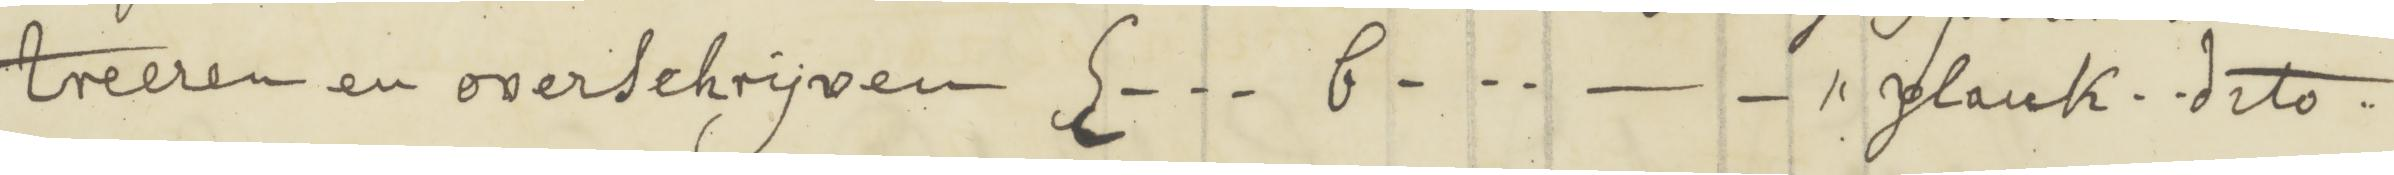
treeren en overschrijven { - - - 6 - - - — — „ plank. dito.
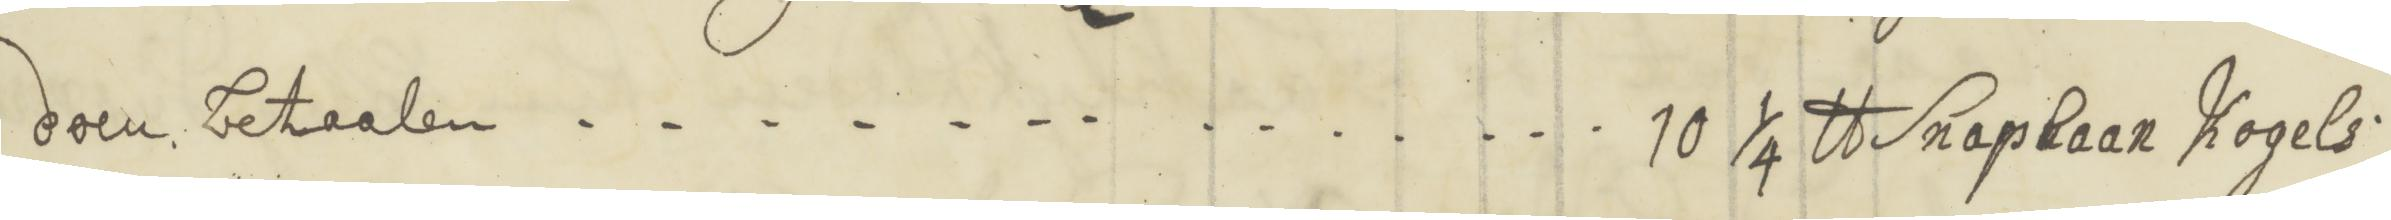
doen betaalen - - - - - - - - - . . . . . 10¼ lb Snaphaan Kogels
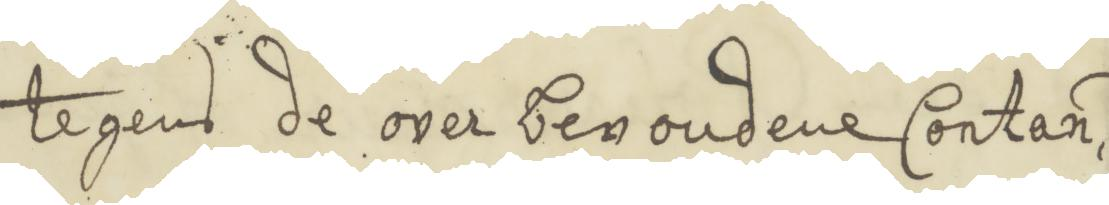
tegens de over bevondene Contan
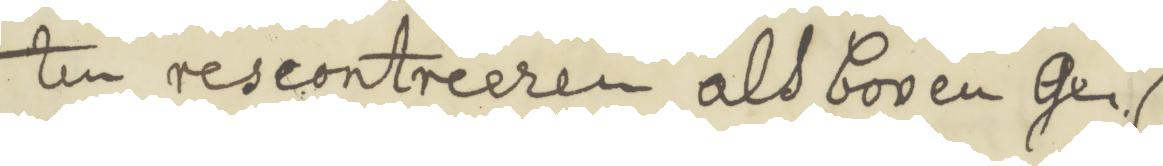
ten rescontreeren als boven ge„
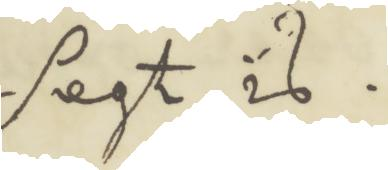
segt is -
